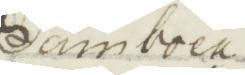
Jamboer
